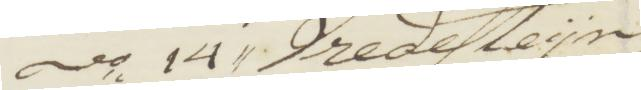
d„o 14 „ Vredesteijn
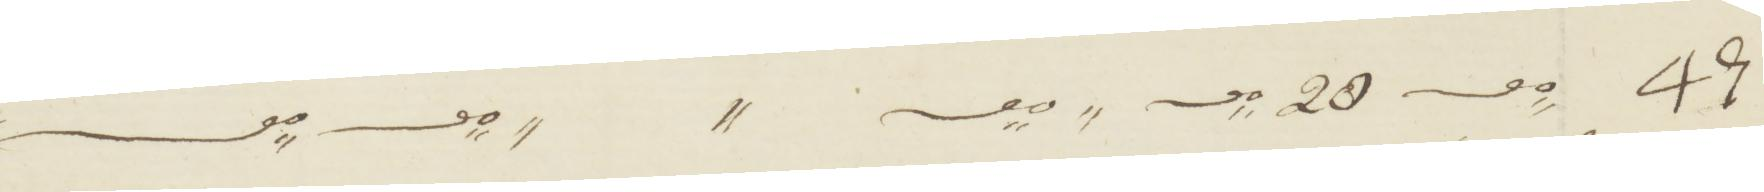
_„o _„o „ „ _„o „ _„o 28 _„o 47
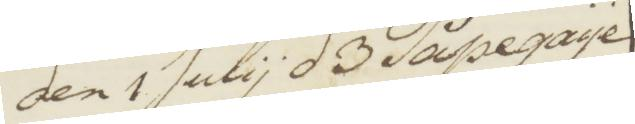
den 1 Julij d' 3 Papegaije
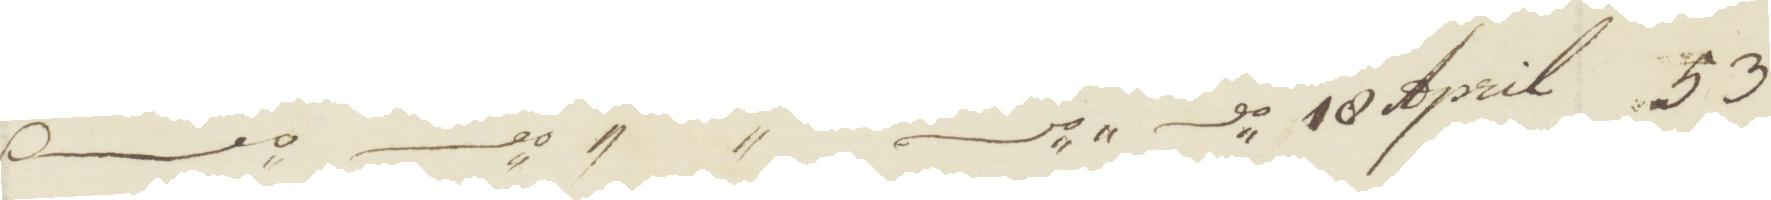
_„o _„o „ „ _„o „ _„o 18 April 53
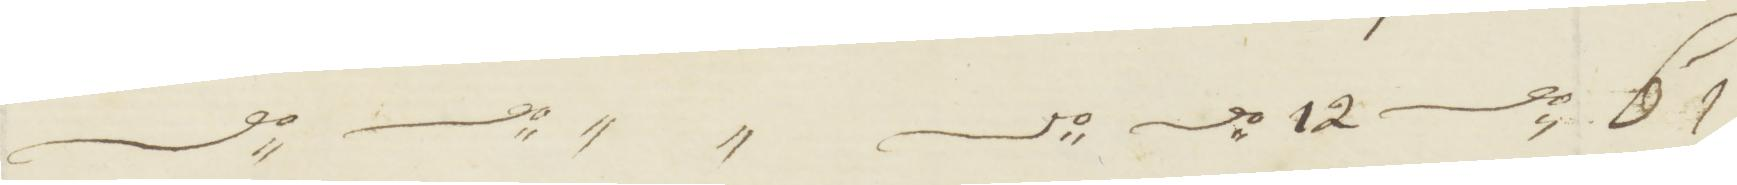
_„o _„o „ „ _„o „ _„o 12 _„o 61
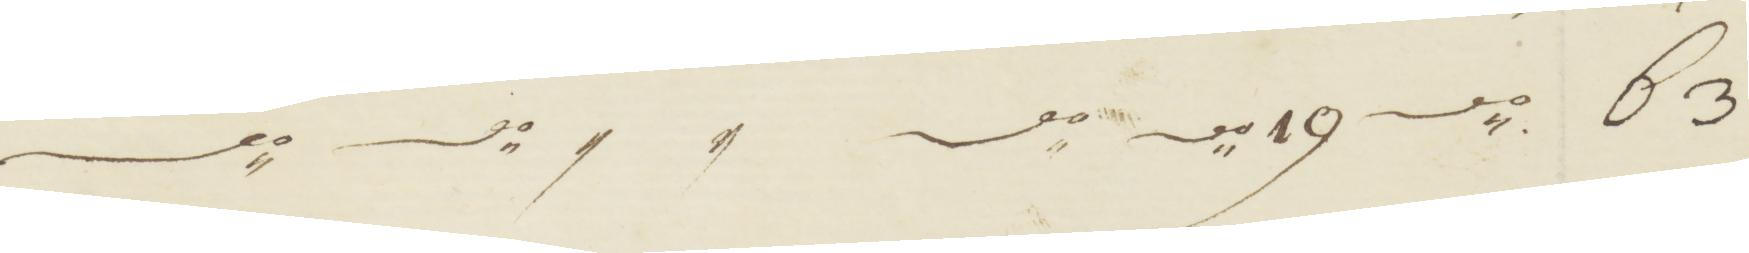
_„o _„o „ „ _„o „ _„o 19 _„o. 63
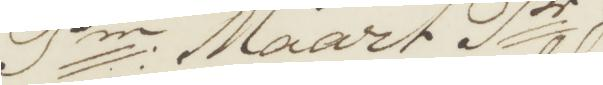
P=m: Maart P=r
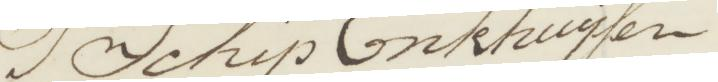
'T Schip Enkhuijsen
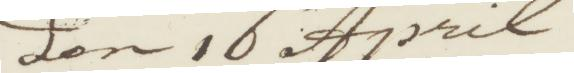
den 16 April
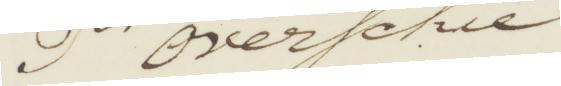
Pr overschie
